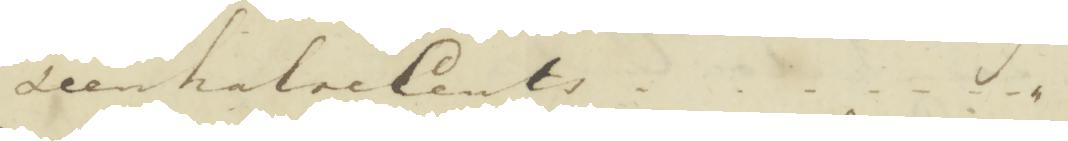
& een halve Cents- - - - - - „
